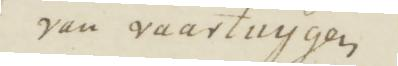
van vaartuijgen
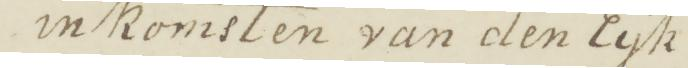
inkomsten van den Eijk
